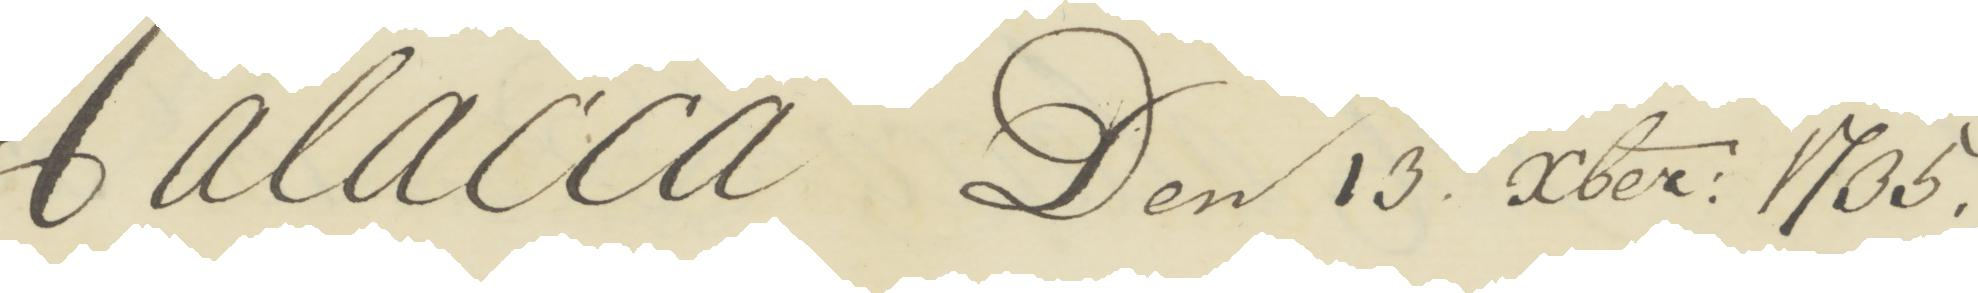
Van Malacca Den 13:' xber: 1735.
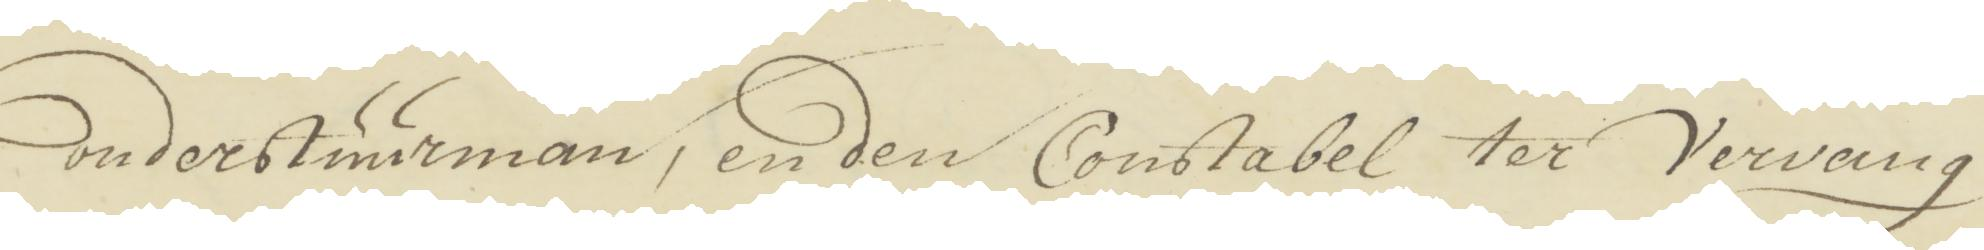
onderstuurman, en den Constabel ter vervang
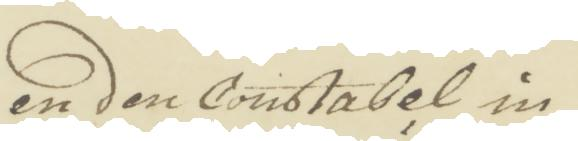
en den Constabel in
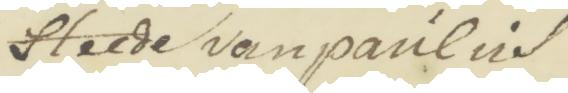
steede van paulus
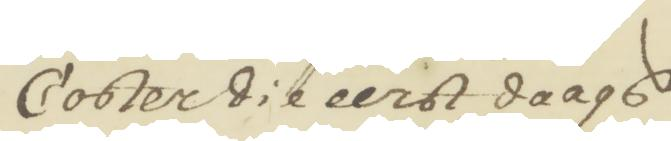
Coster die eerst daags
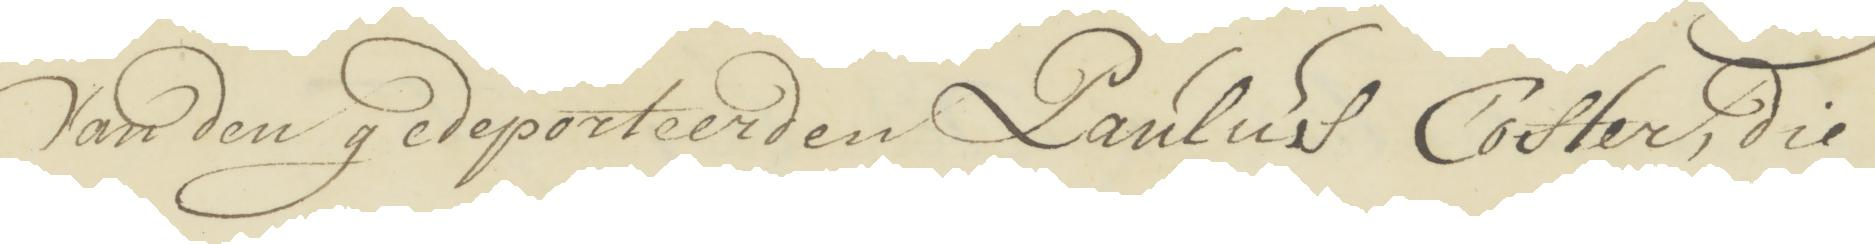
van den gedeporteerden Paulus Coster, die
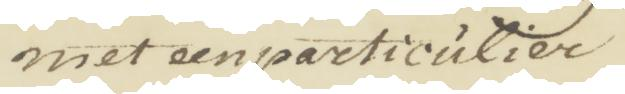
met een particulier
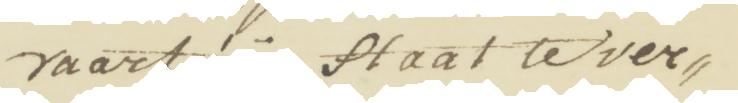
vaartuijg staat te ver„
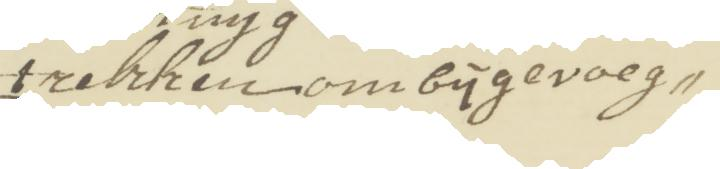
trekken om bijgevoeg„
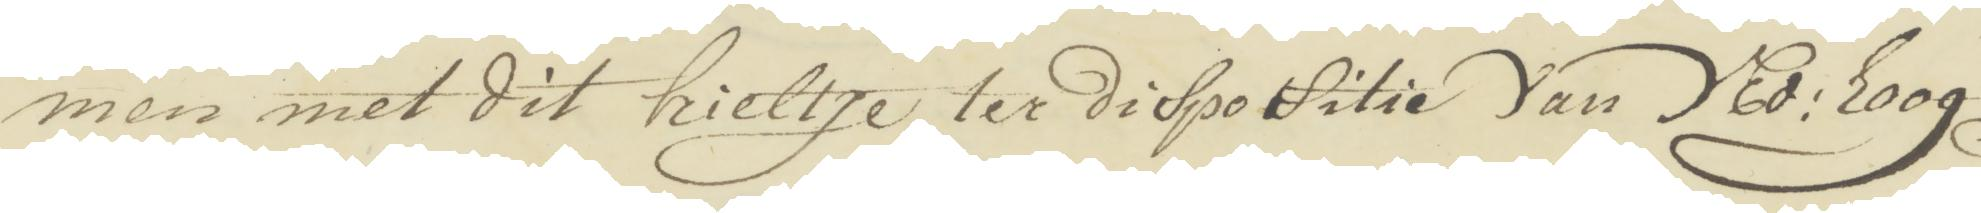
men met dit kieltje ter dispositie van VEd: hoog
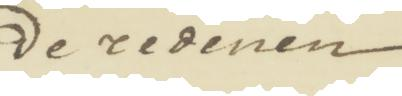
de redenen
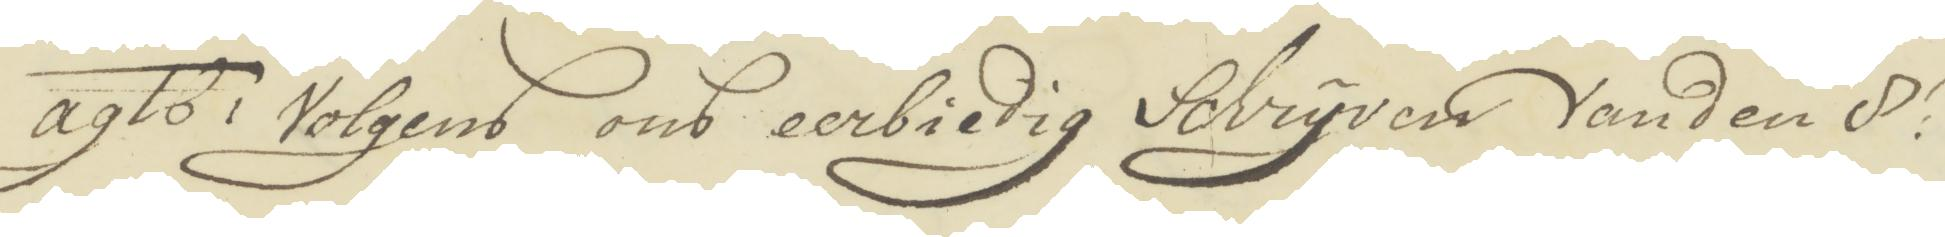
agtb: volgens ons eerbiedig schrijven van den 8:'
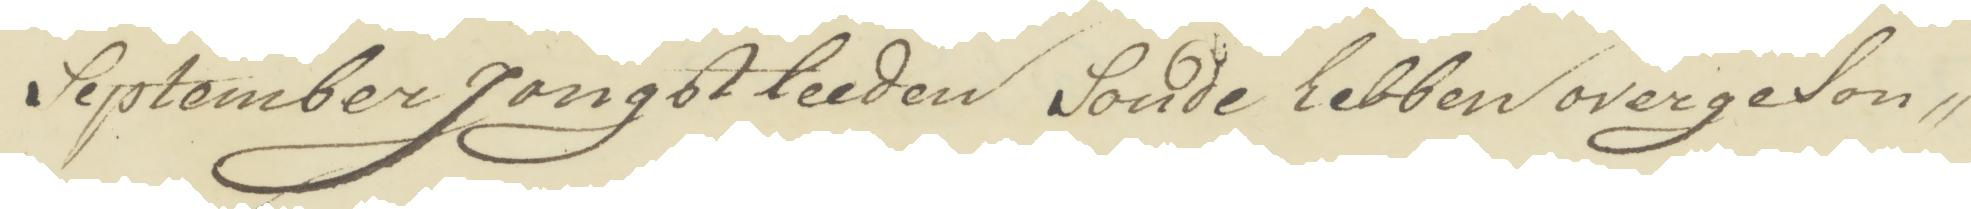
september Jongstleeden soude hebben overgeson„
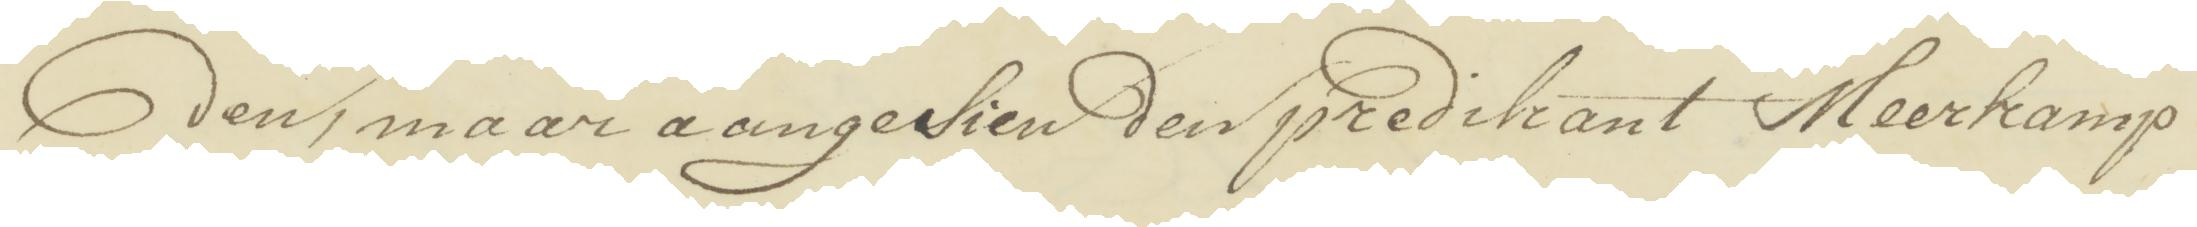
den, maar aangesien den predikant Meerkamp
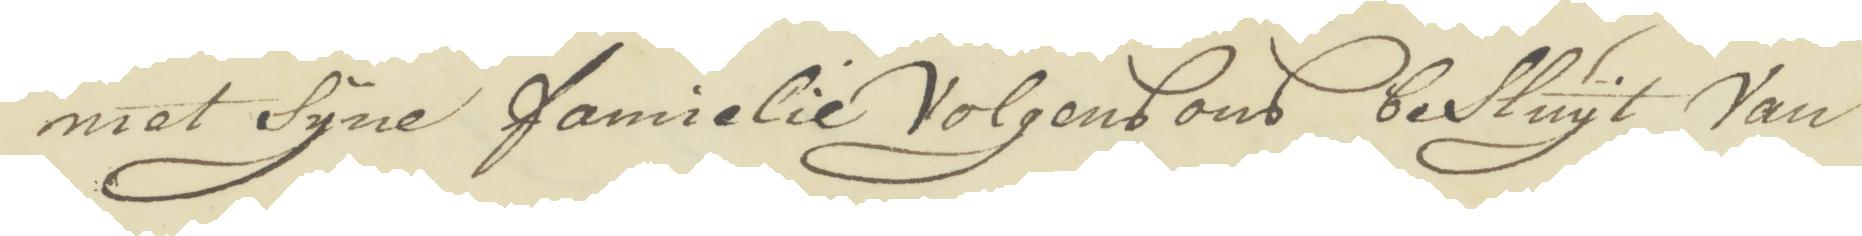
met sijne famielie volgens ons besluijt van
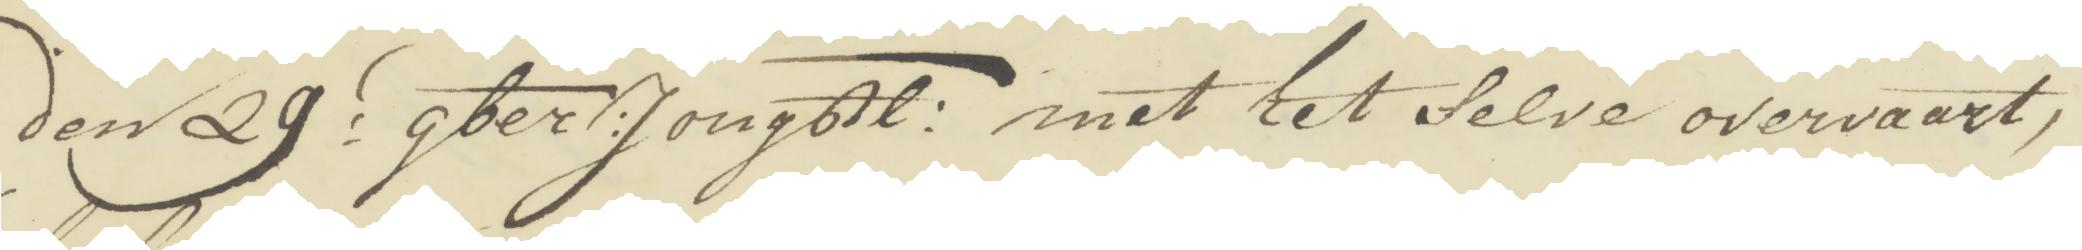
den 29:' 9ber: Jongstl: met het selve overvaart,
